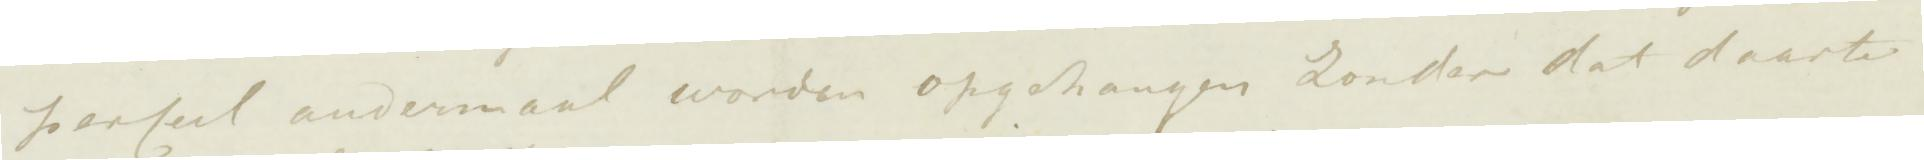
perceel andermaal worden opgehangen zonder dat daarte
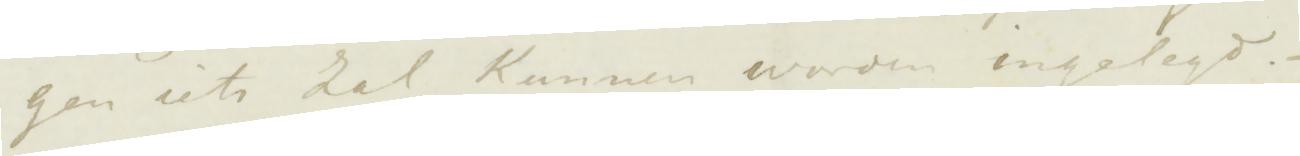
gen iets Zal Kunnen worden ingelegd.
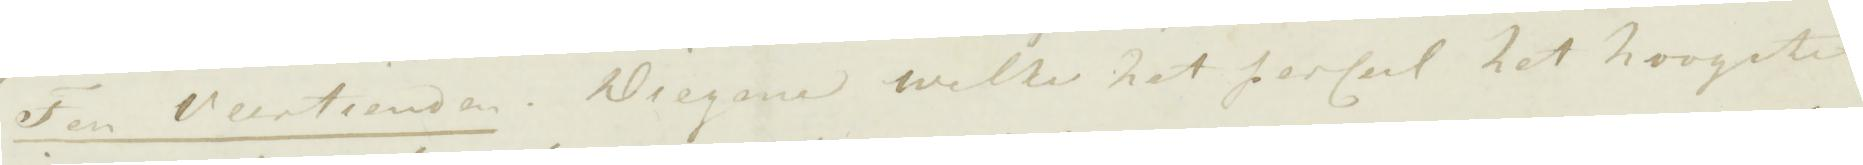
Ten Veertienden. Diegene welke het perceel het hoogste
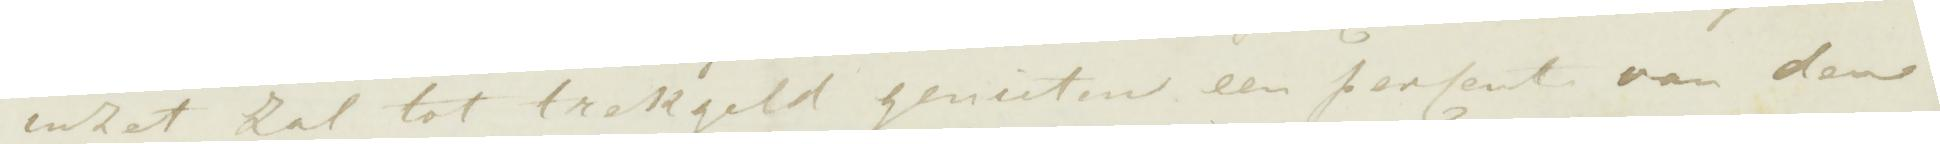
inzet Zal tot trekgeld genieten een percent van den
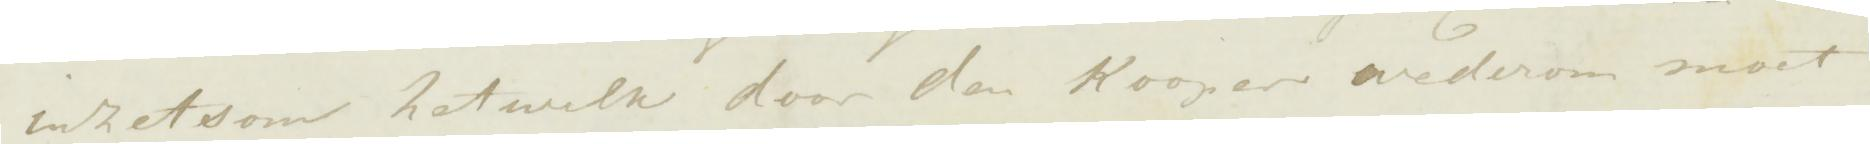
in zetsom het welk door den Kooper wederom moet
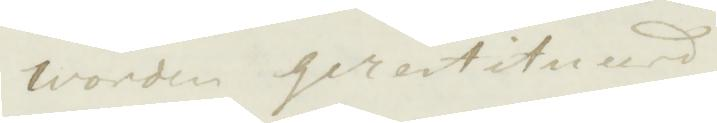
worden gerestitueerd
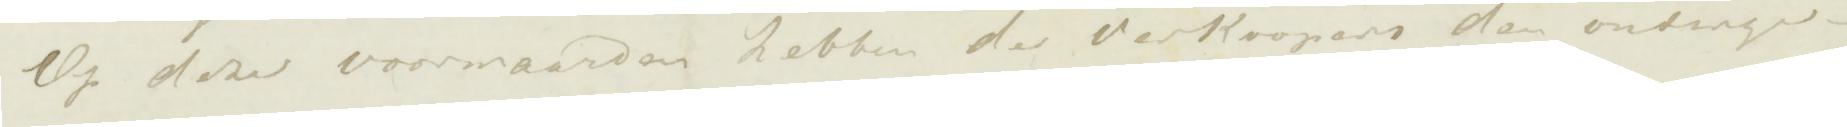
Op deze voorwaarden hebben de verkoopers den onderge-
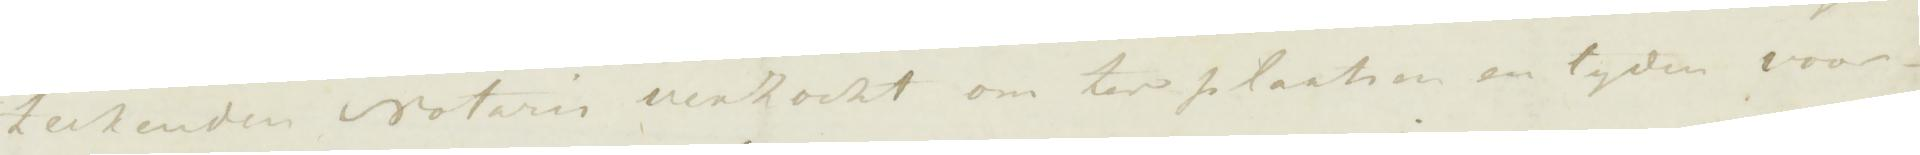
teekenden Notaris verzocht om ter plaatsen en tyden voor
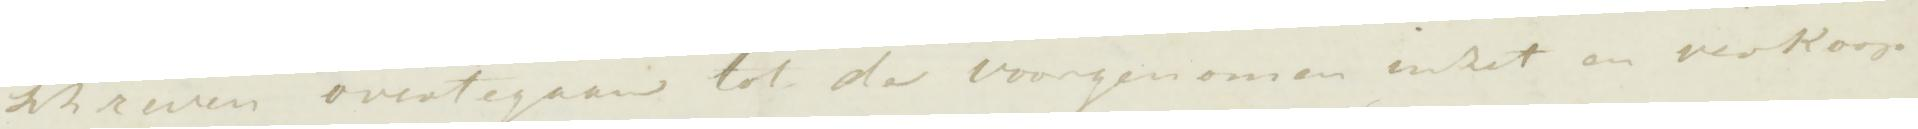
schreven over te gaan tot de voorgenomen inzet en verkoop
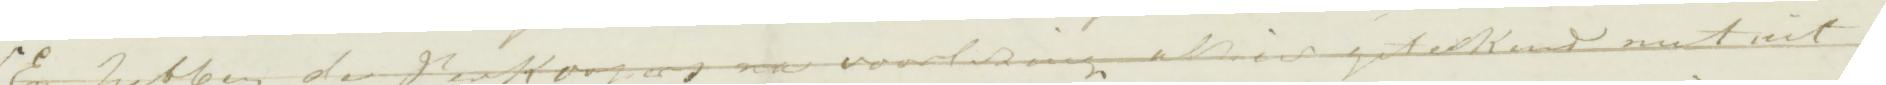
¶En hebben de Verkoopers na voorlezing alhier getekend met uit
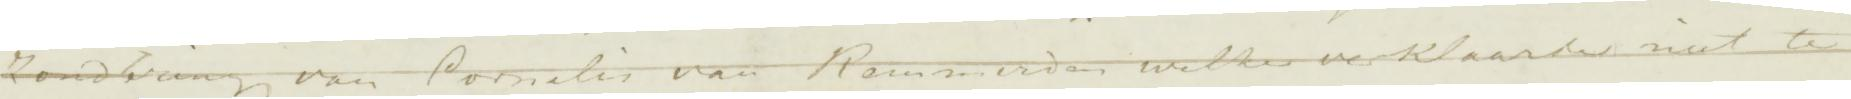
Zondering van Cornelis van Remmerden welke verklaarde niet te
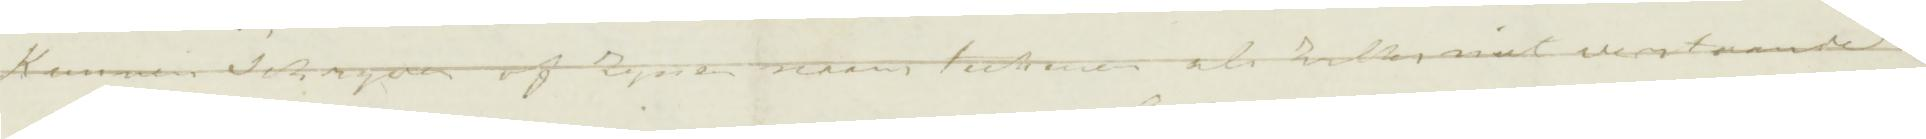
kunnen schrijven of zijnen naam teekenen als zulk, niet verstaande.
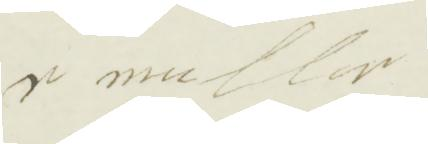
r muller
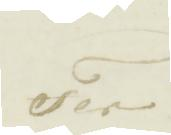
Ter
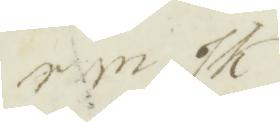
rm JK
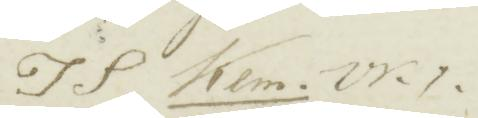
JS Kem. VK ./.
